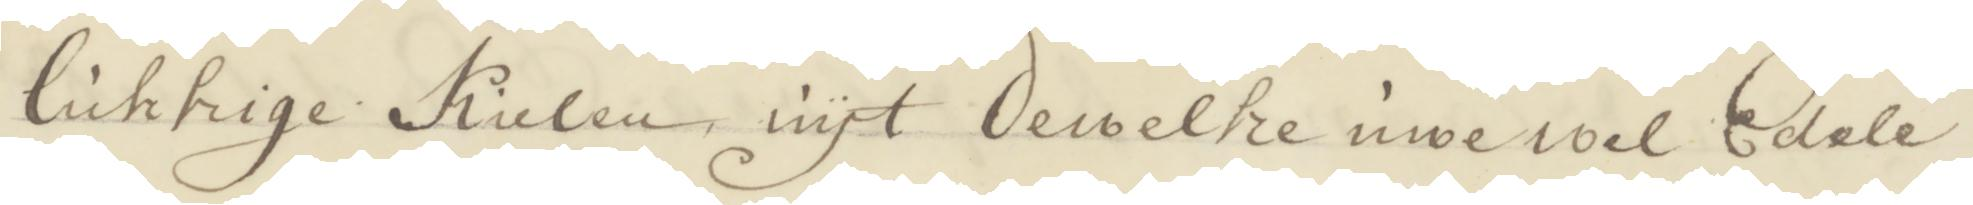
lukkige Kielen uijt dewelke uwe wel Edele
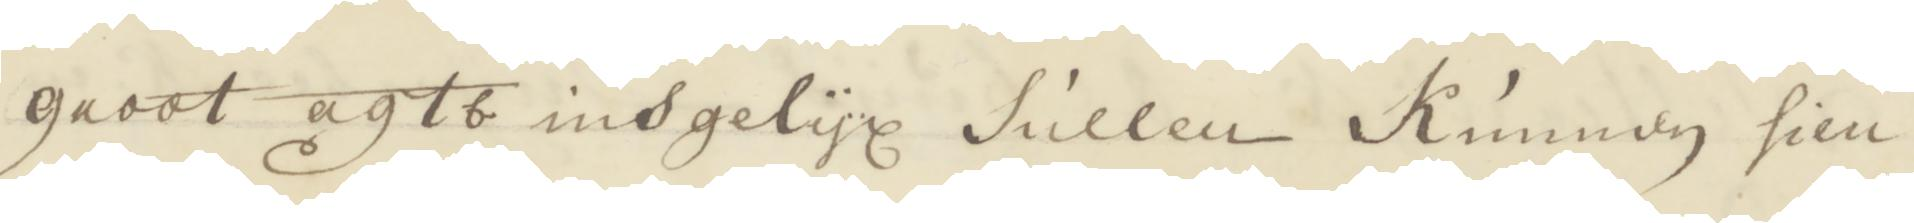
groot agtb insgelijx sullen kunnen sien
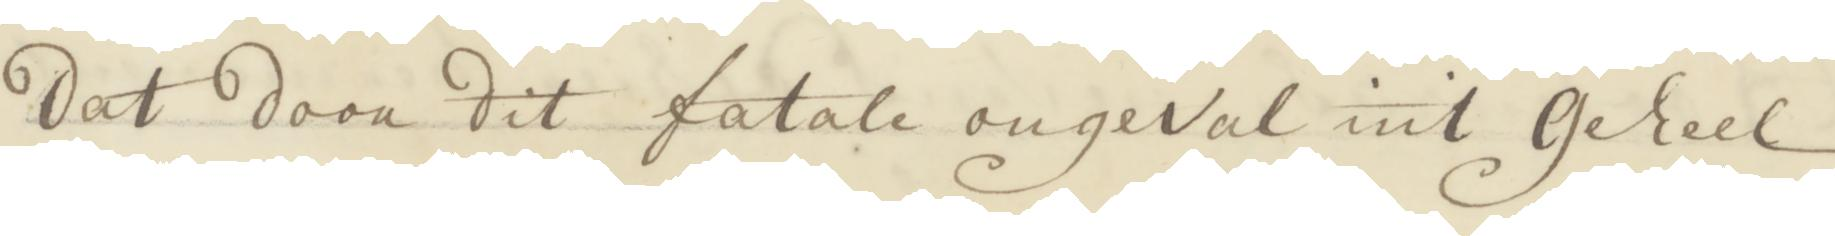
dat door dit fatale ongeval in’t geheel
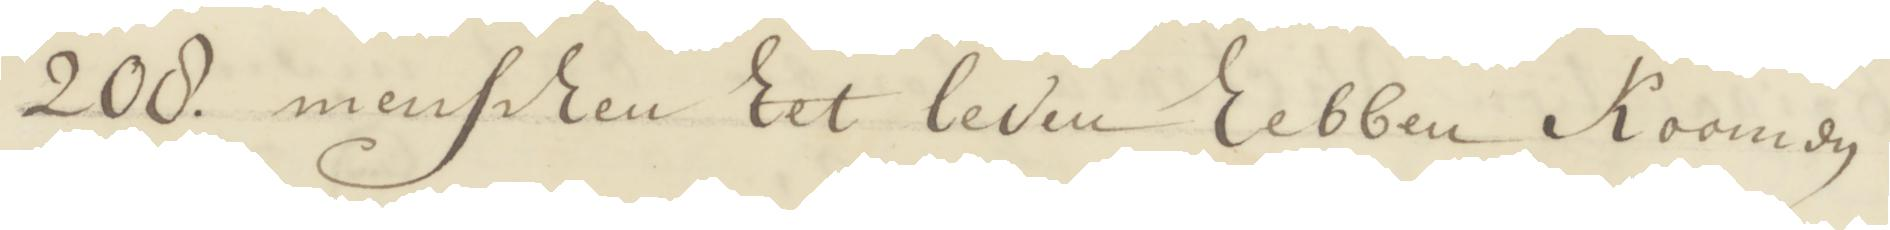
208. menschen het leven hebben koomen
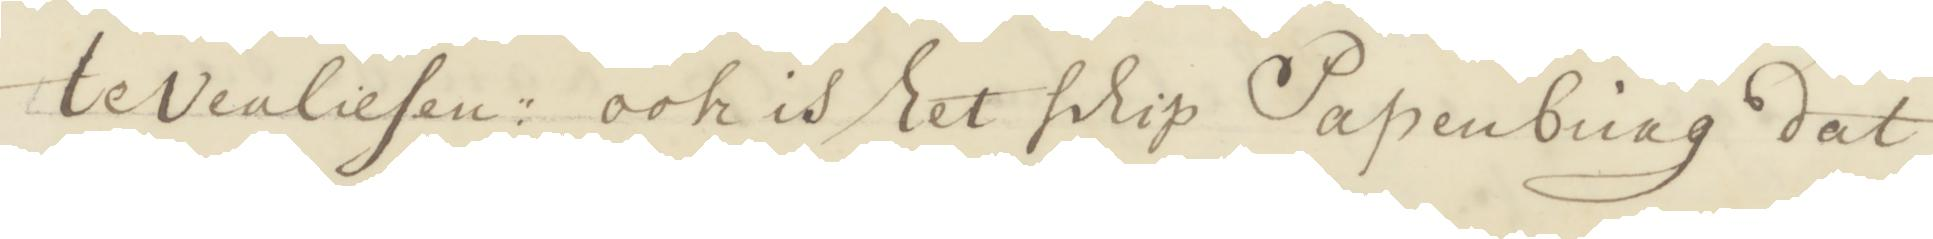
te verliesen: ook is het schip Papenburg dat
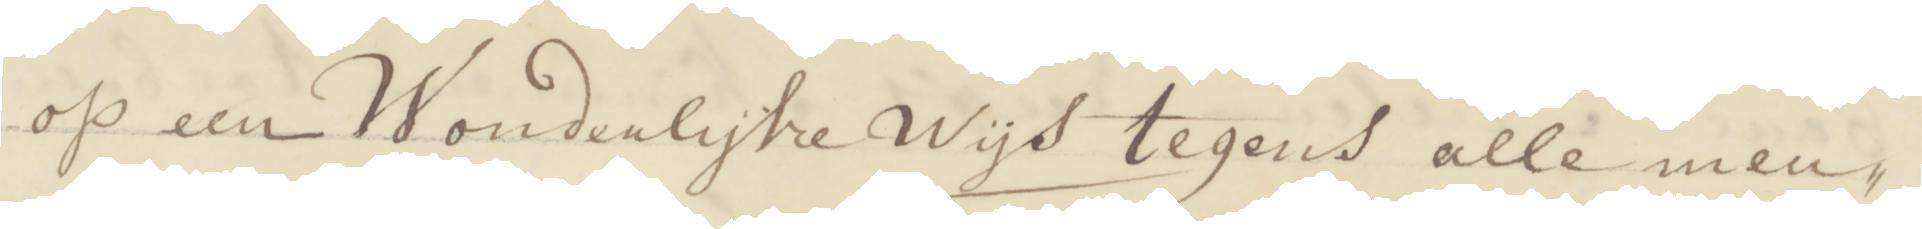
op een Wonderlijke wijs tegens alle men„
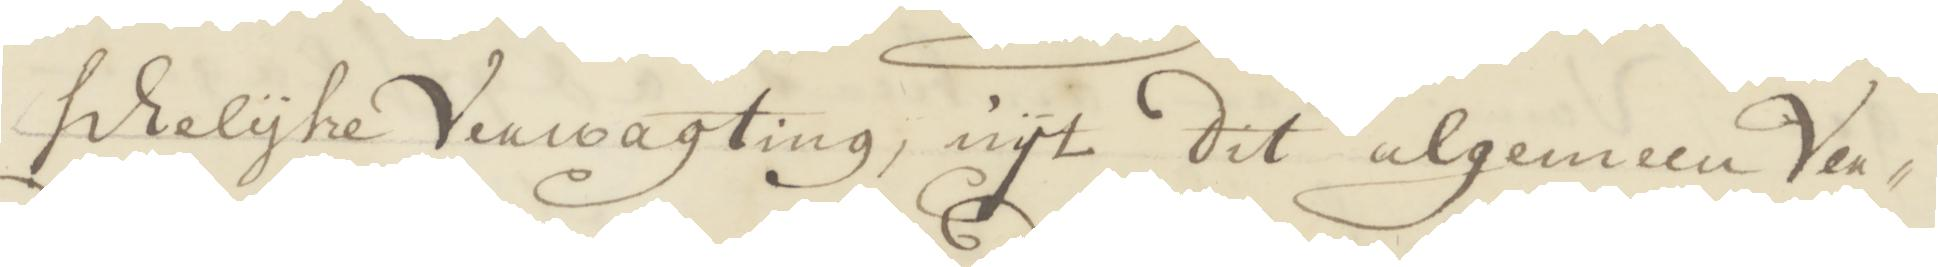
schelijke verwagting, uijt dit algemeen ver„
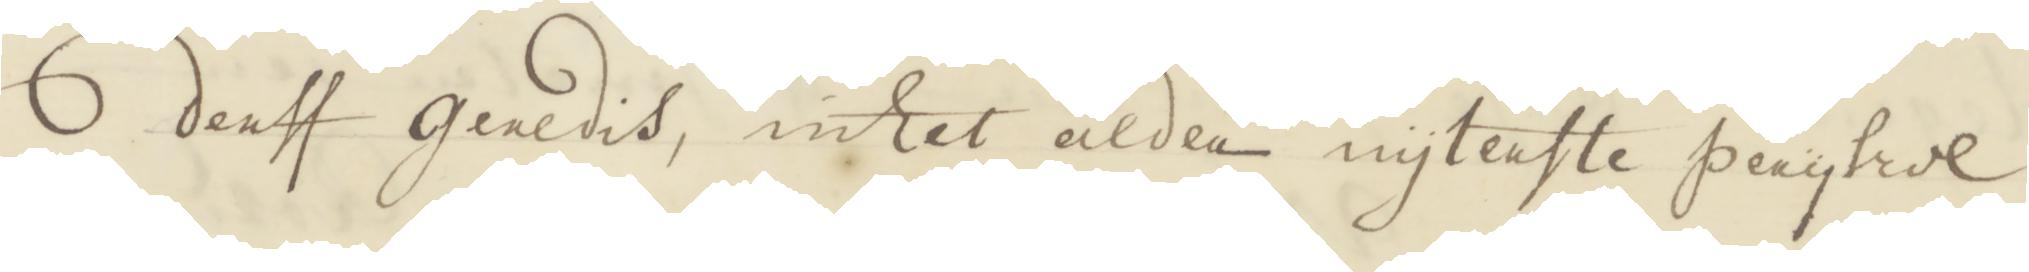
derff gered is, in het alder uijterste perijkel
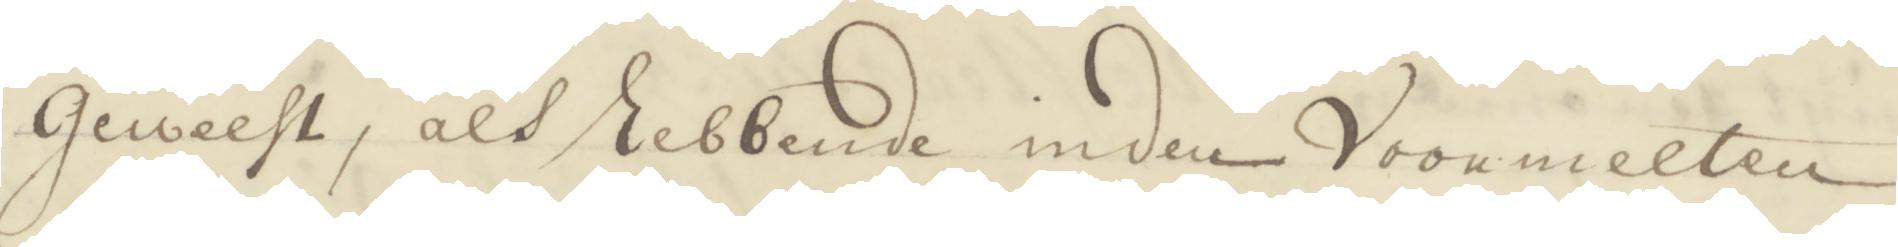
geweest, als hebbende in den voormelten
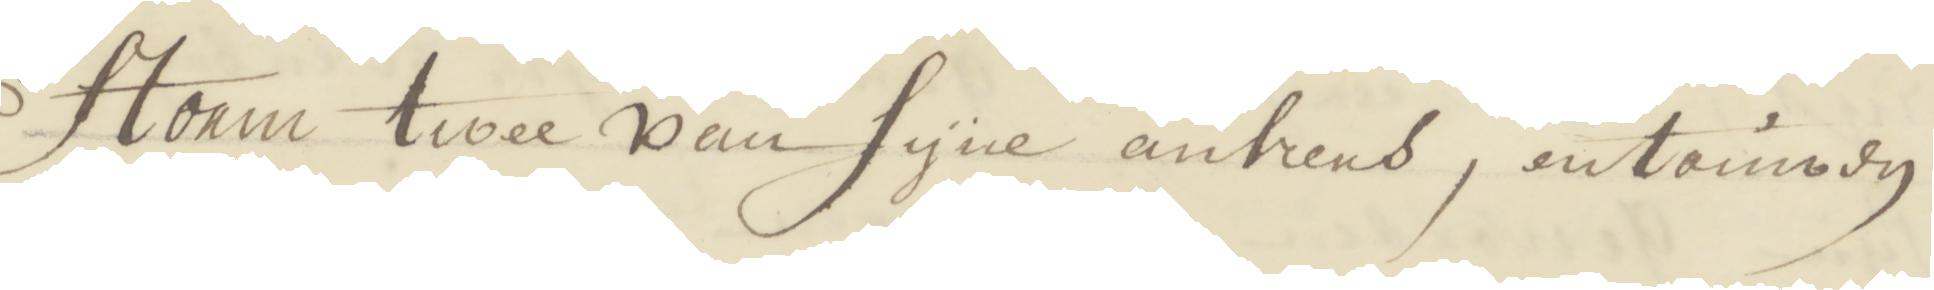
storm twee van sijne ankers, en touwen
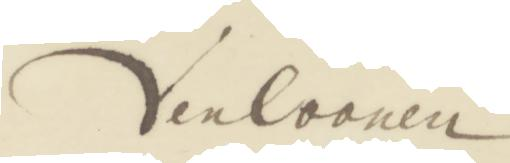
verlooren
